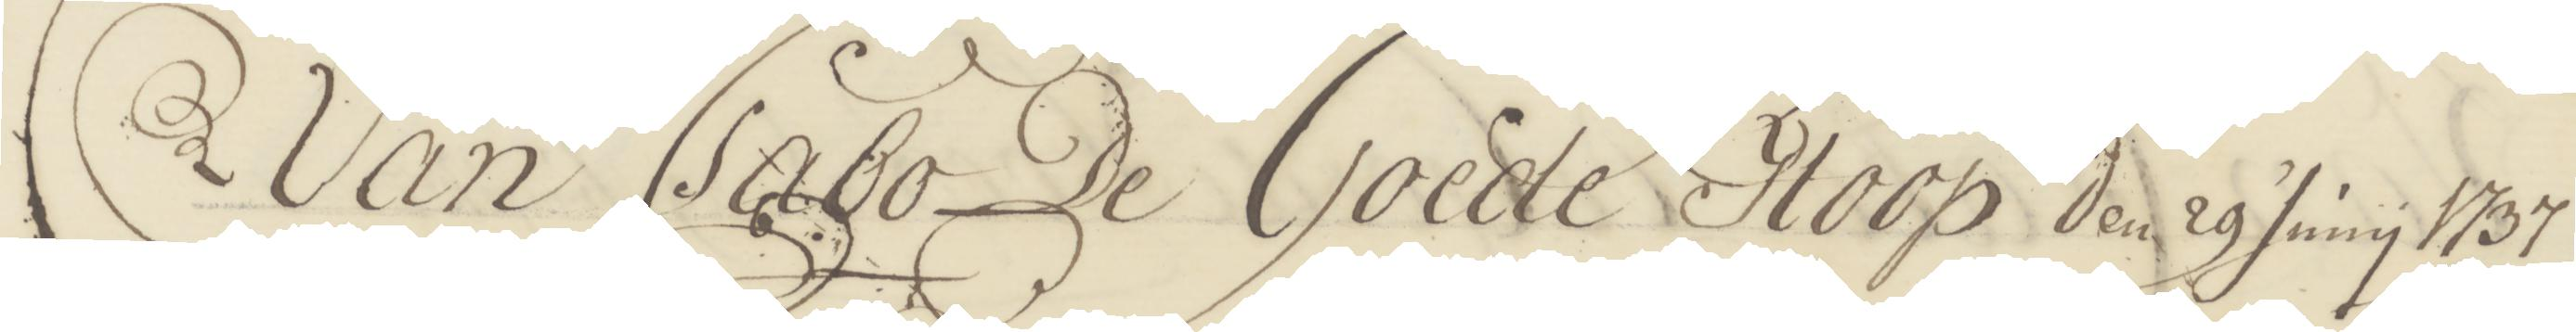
Van Cabo De Goede Hoop den 29' Junij 1737
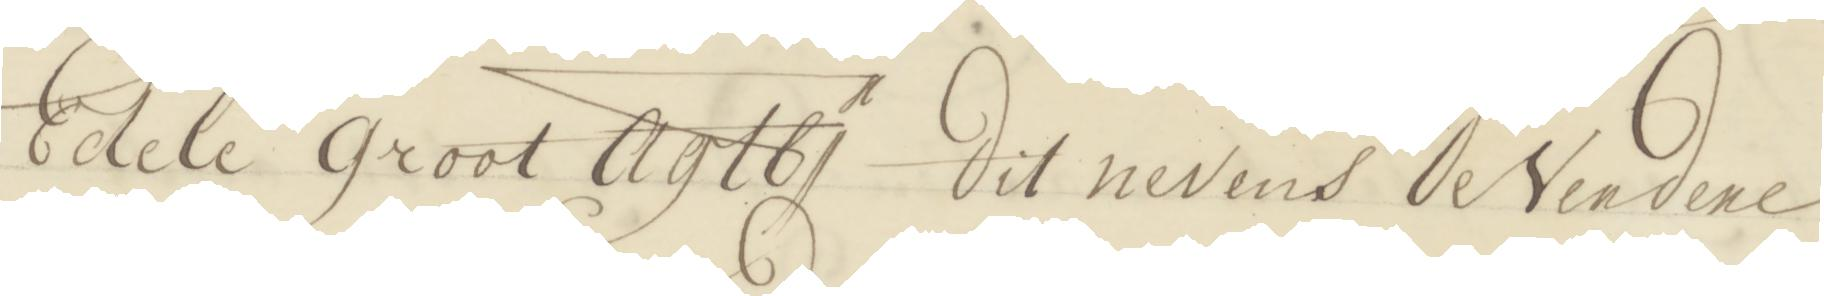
Edele groot Agtb:r dit nevens de verdere
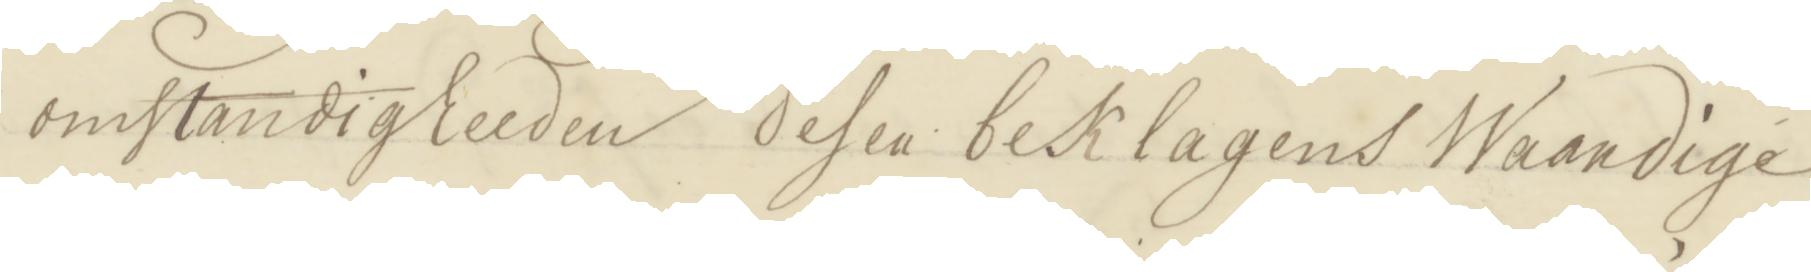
omstandigheeden deser beklagens waardige
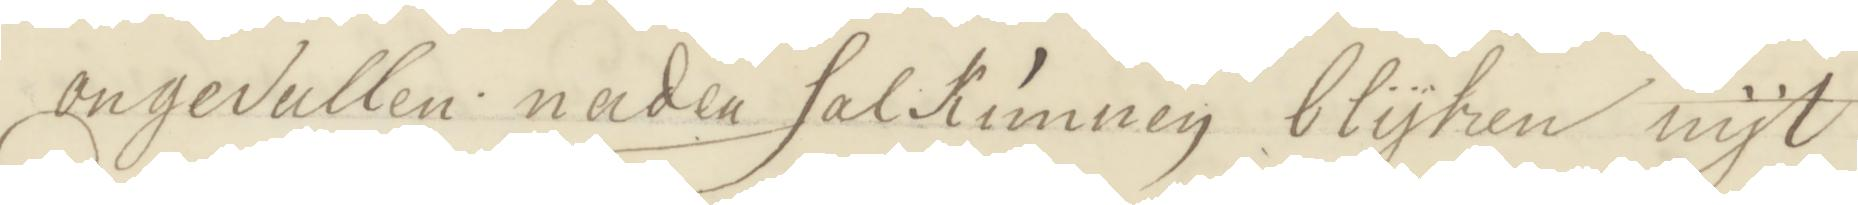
ongevallen nader sal kunnen blijken uijt
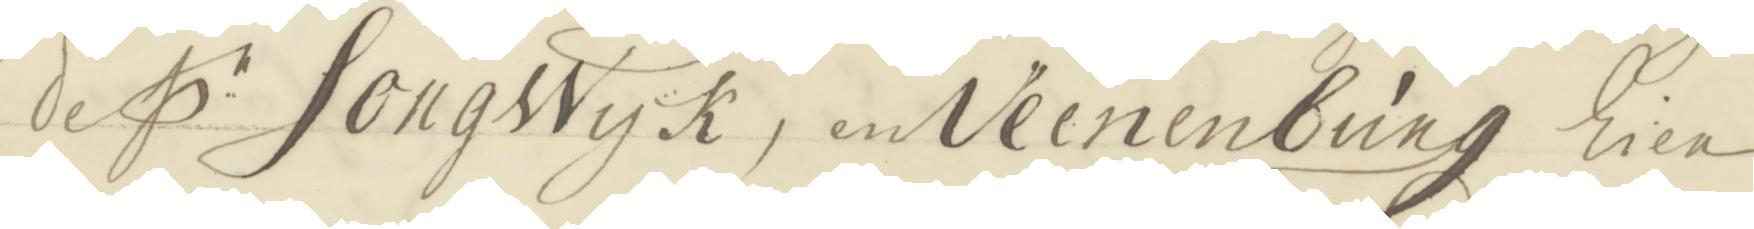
de p:r Sorgwijk, en veenenburg hier
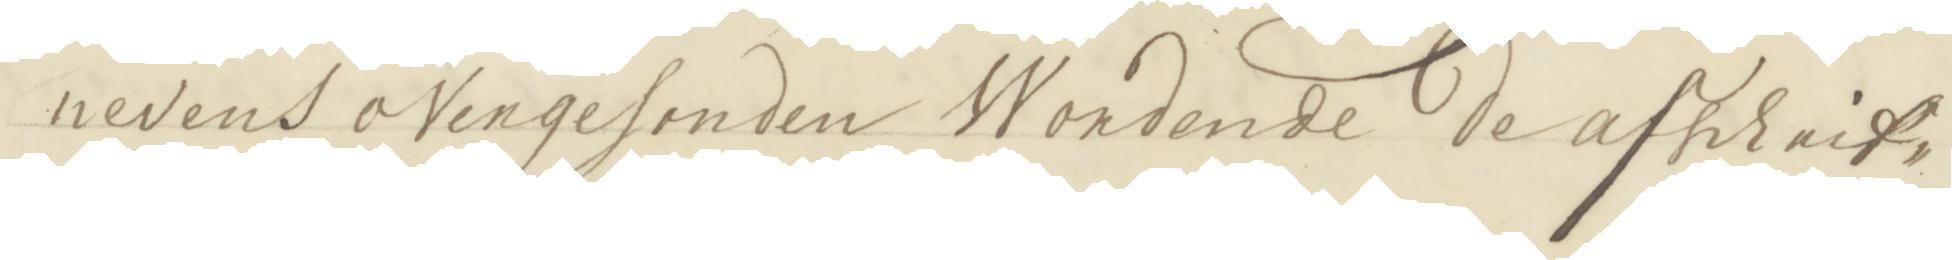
nevens overgesonden wordende de afschrif„
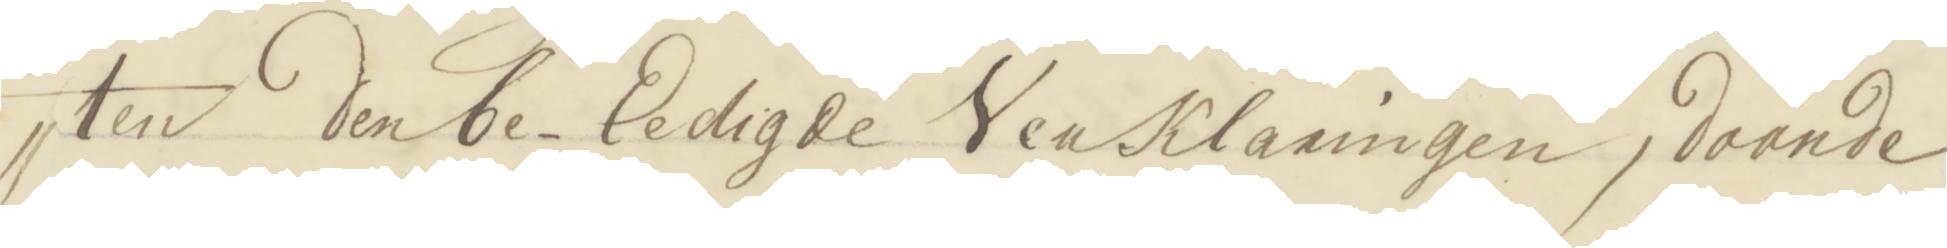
„ten den be-Eedigde verklaringen, door de
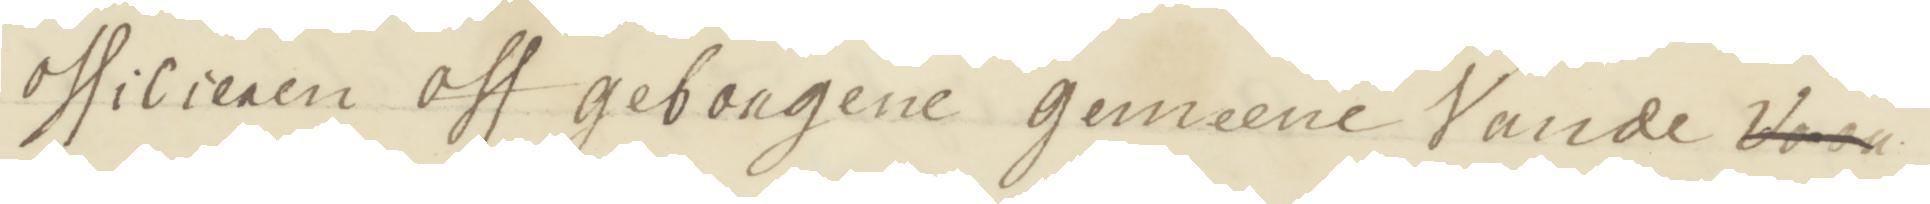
officieren off geborgene gemeene van de voor
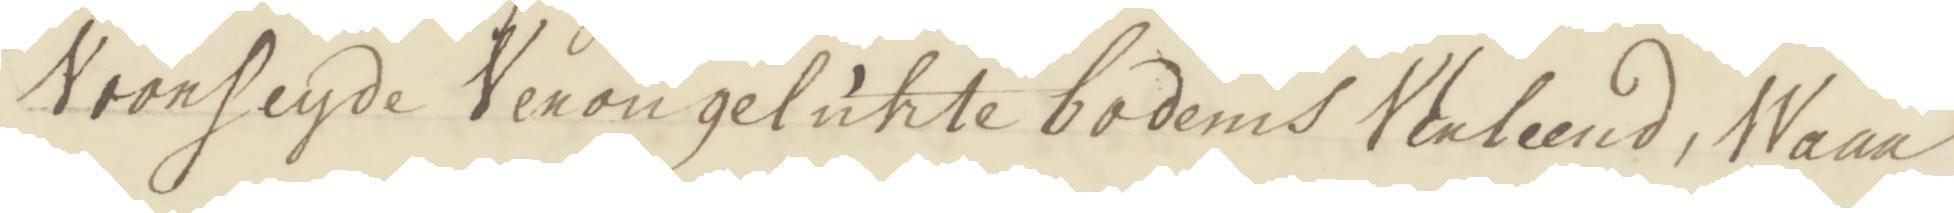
voorseyde verongelukte bodems verleend, waar
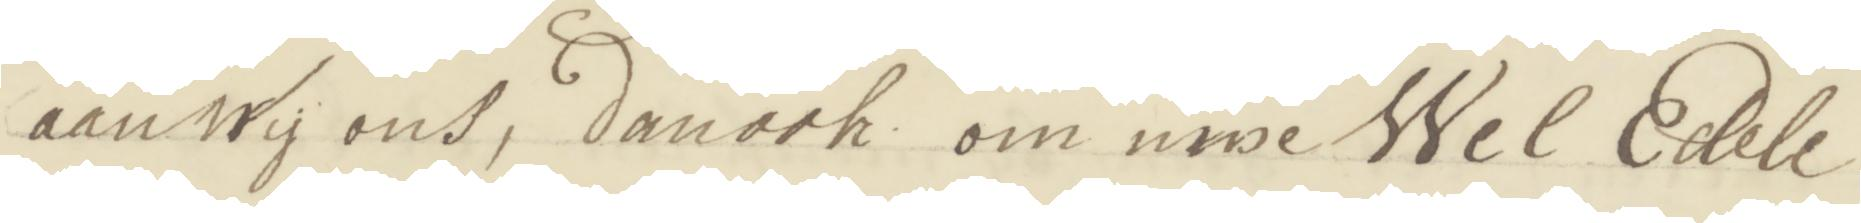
aan wij ons, dan ook om uwe Wel Edele
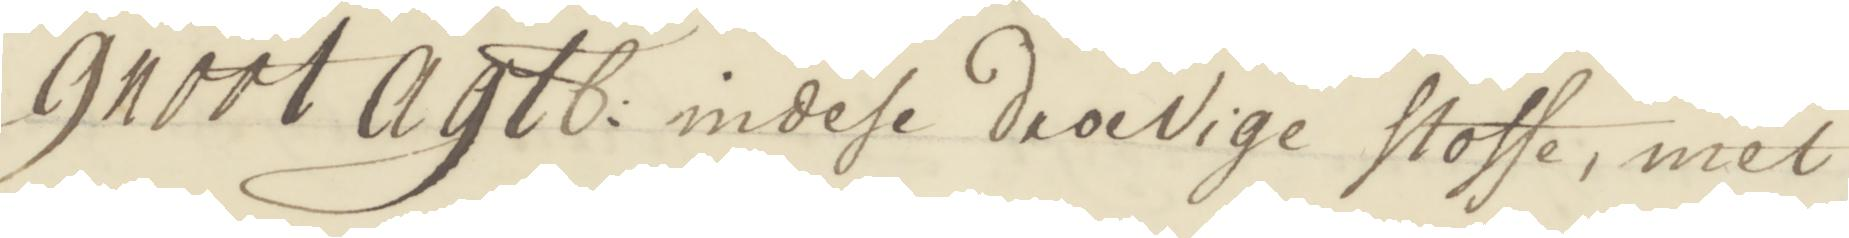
groot agtb: in dese droevige stoffe, met
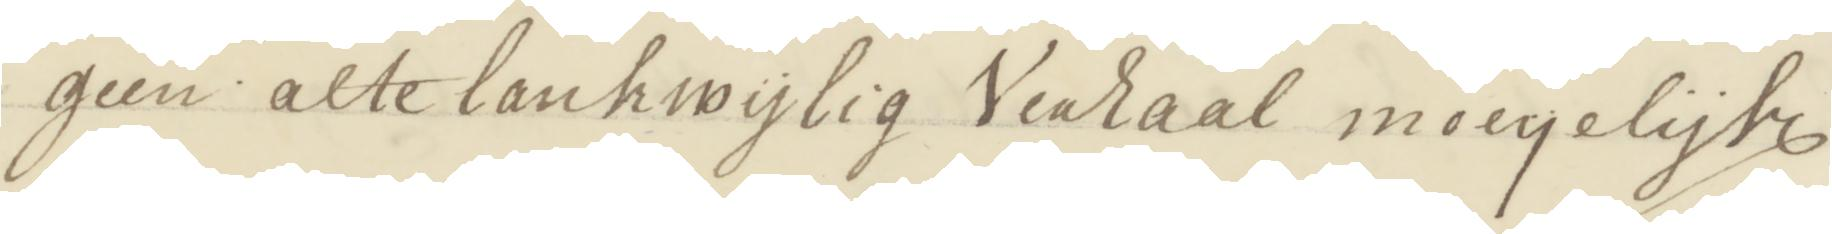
geen alte lankwijlig Verhaal moegelijk
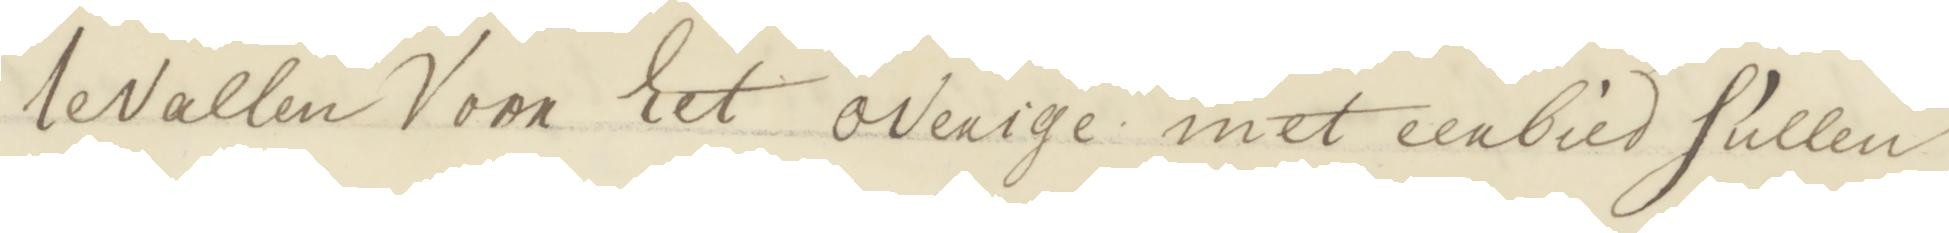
tevallen voor het overige met eerbied sullen
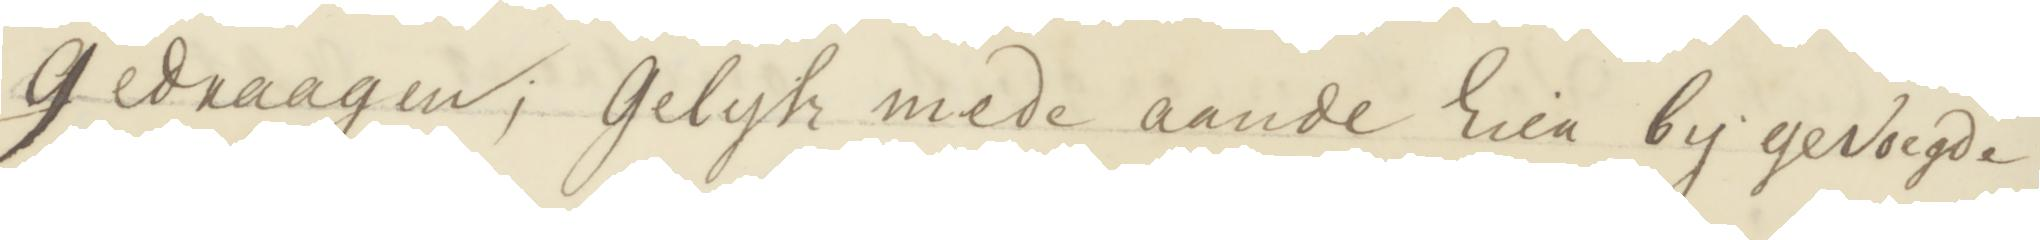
gedraagen; gelyk mede aande hier by gevoegde
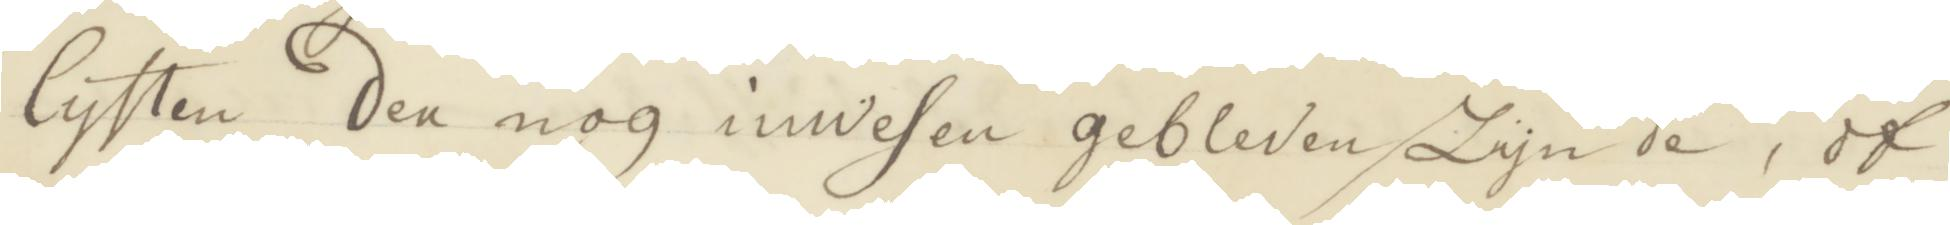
lysten der nog inwesen gebleven zijn de, of
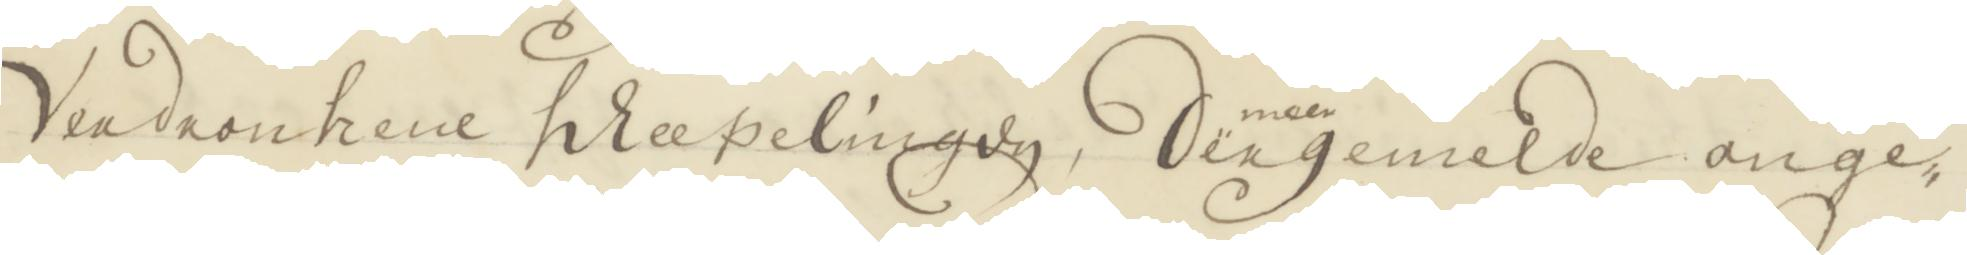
verdronkene scheepelingen, der gemelde onge„
